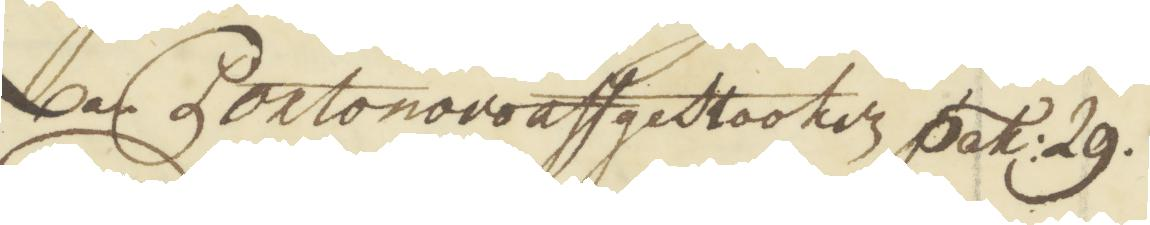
van Portonovo affgestooken pak: 29.
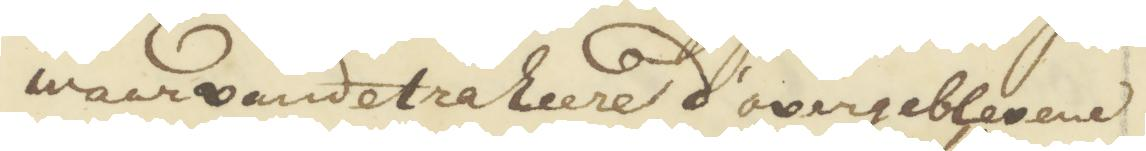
waarvan detraheere d'overgeblevene
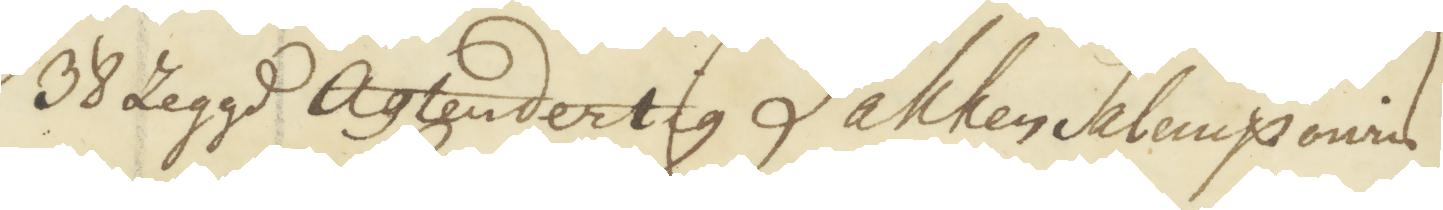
38 zegge Agtendertig Pakken Salempouris
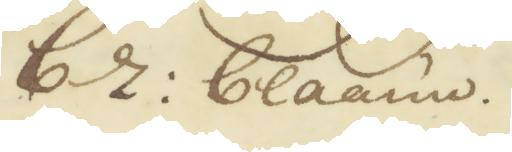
br: blaauw.
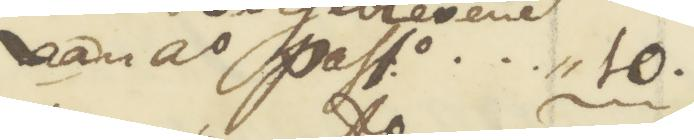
van ao pass:o . . . „ 10
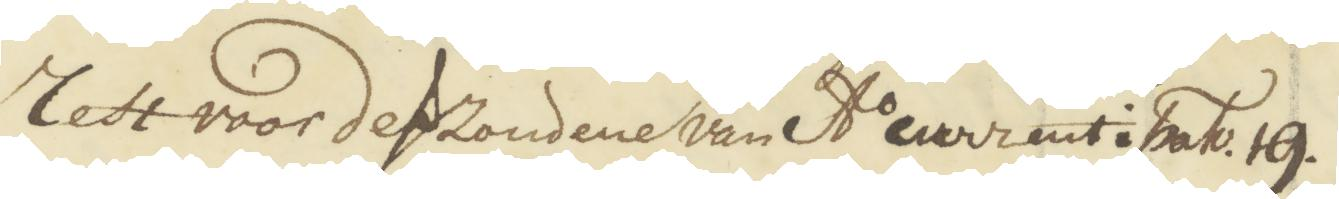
rest voor de verzondene van Ao everzenti pak: 19.
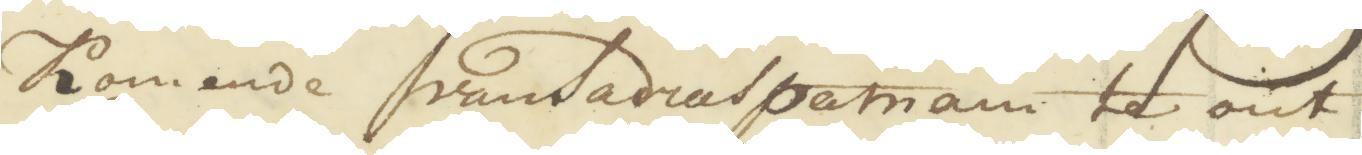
komende van Sadraspatnam te ont
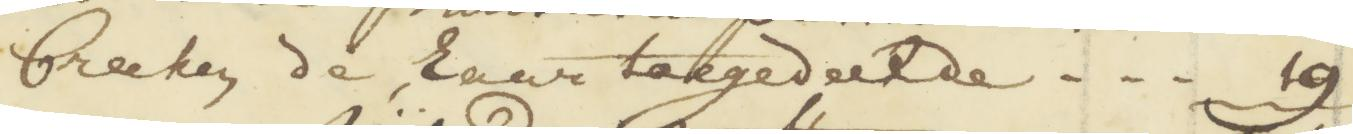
breeken de haar toegedeelde - - -19
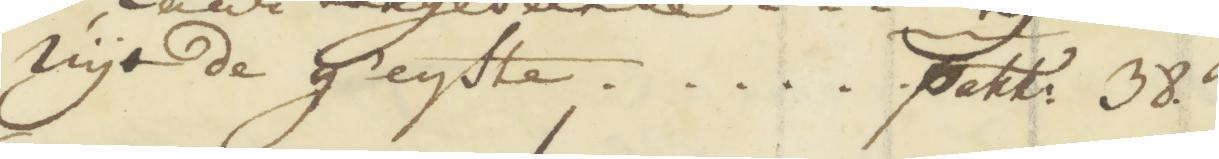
uijt de g'eyste . . . . . . pakk: 38.
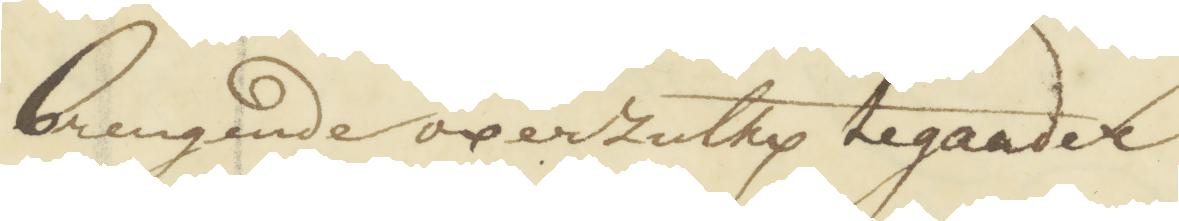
brengende overzulkx te gaader
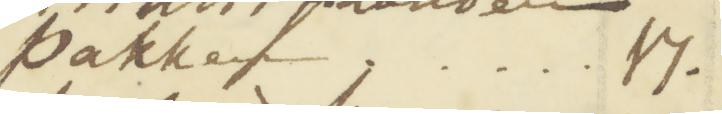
pakken . . . . . 17.
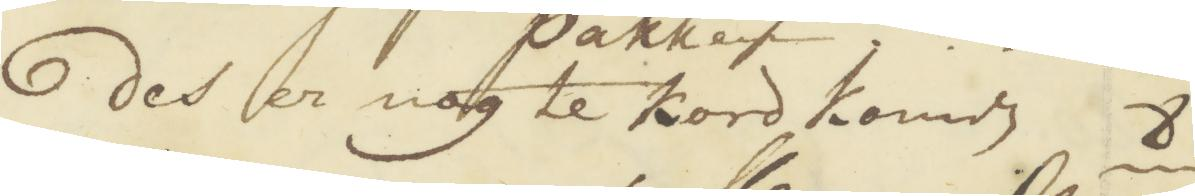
des er nog te kord komen 8
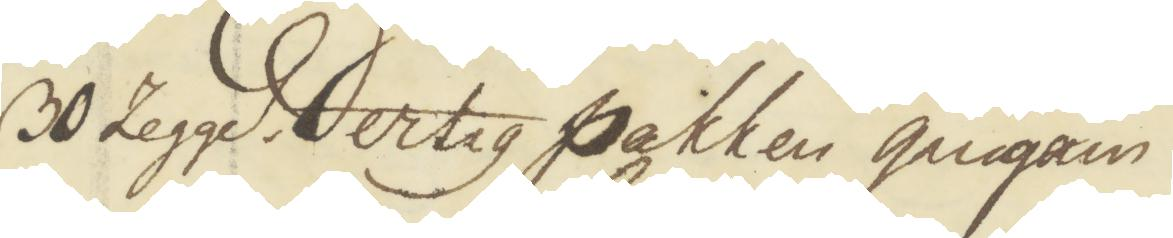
30 zegge dertig pakken gingam
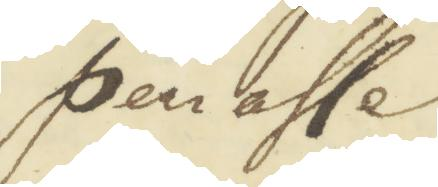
pen asse
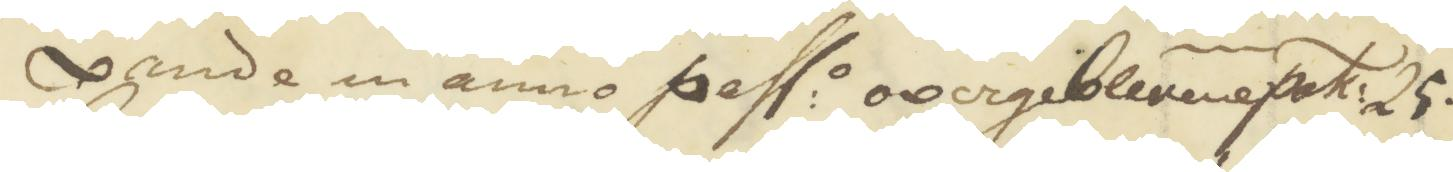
van de in anno pass:o overgeblevene pak: 25
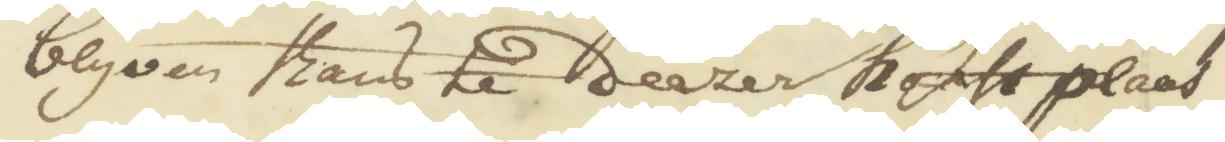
blyven thans te deezer hooftplaas
